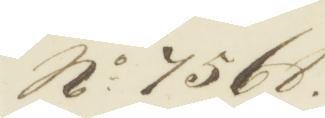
N:o 7568.
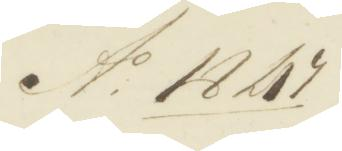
A:o 1847
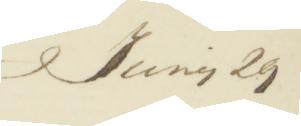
Junij 29
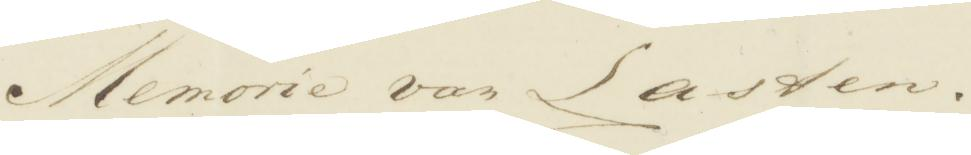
Memorie van Lasten.
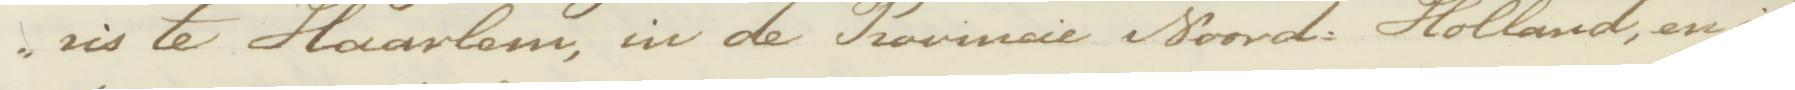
„ris te Haarlem, in de Provincie Noord= Holland, en in
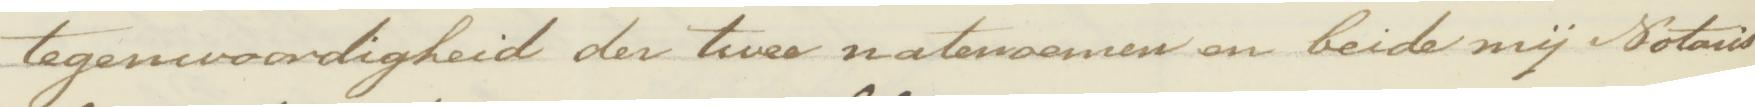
tegenwoordigheid der twee natenoemen en beide mij Notaris
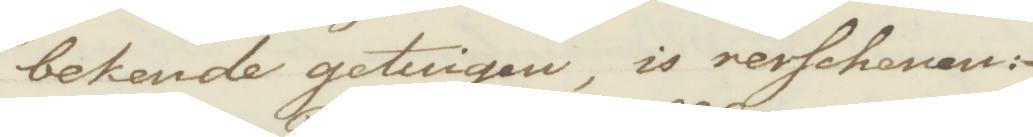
bekende getuigen, is verschenen:
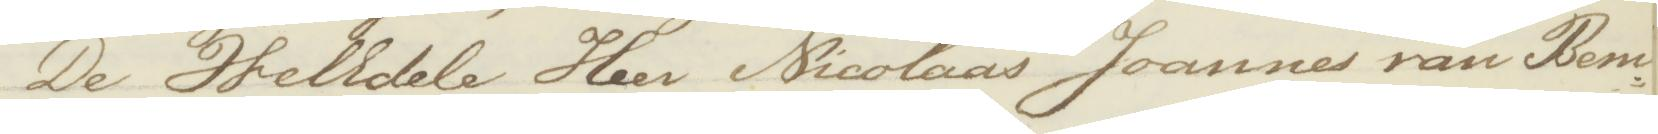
De WelEdele Heer Nicolaas Joanne van Bem„
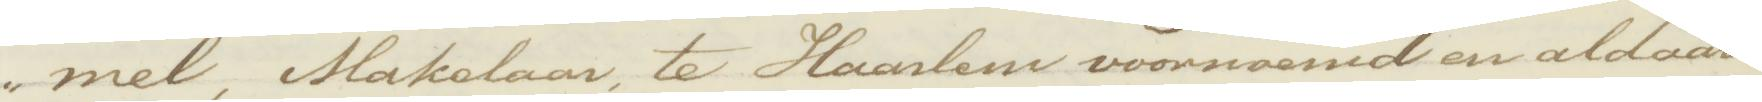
„mel, Makelaar, te Haarlem voornoemd en aldaar
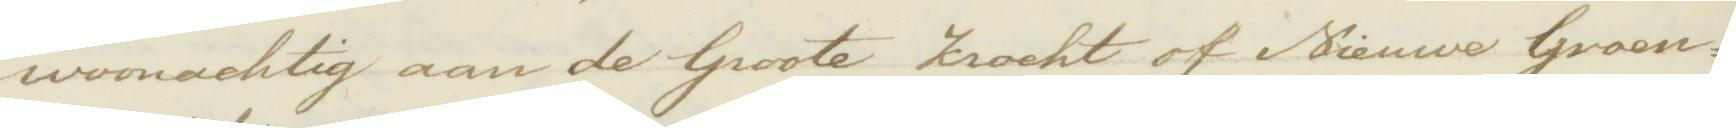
woonachtig aan de Groote krocht of Nieuwe Groen=
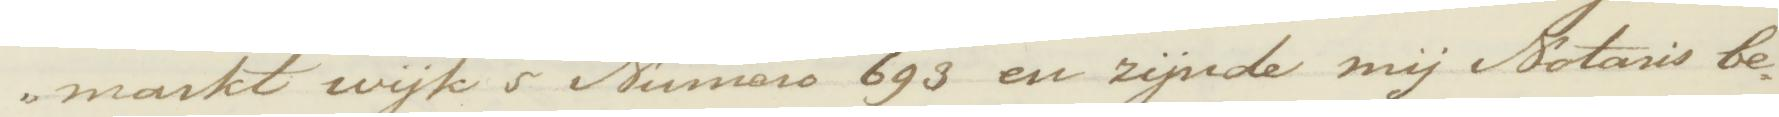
„markt wijk 5 Numero 693 en zijnde mij Notaris be„
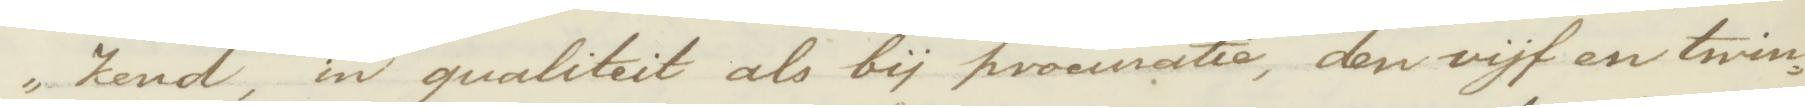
„kend, in qualiteit als bij procuratie, den vijf en twin„
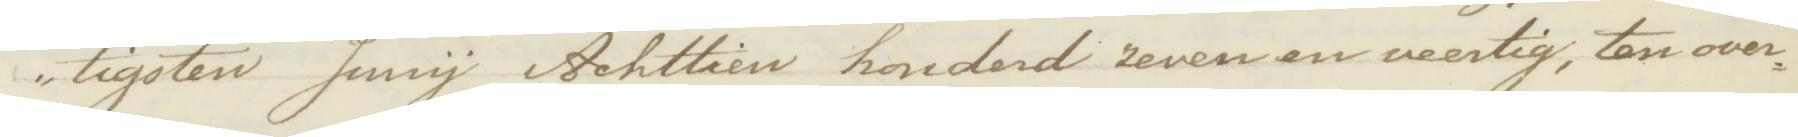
„tigsten Junij Achttien honderd zeven en veertig, ten over„
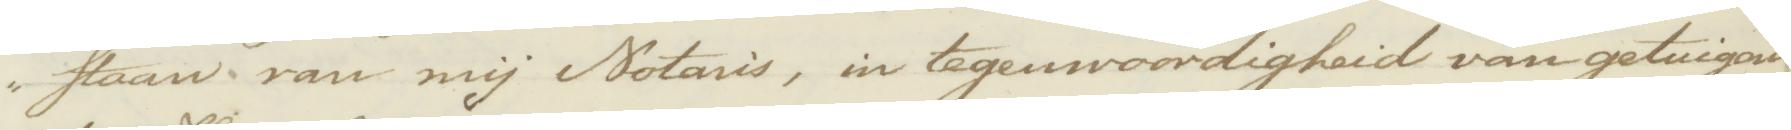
„staan van mij Notaris, in tegenwoordigheid van getuigen
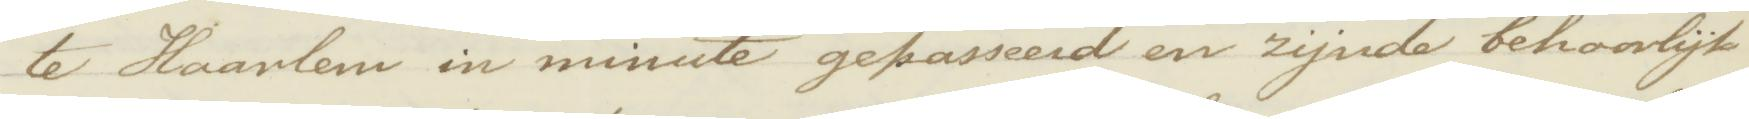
te Haarlem in minute gepasseerd en zijnde behoorlijk
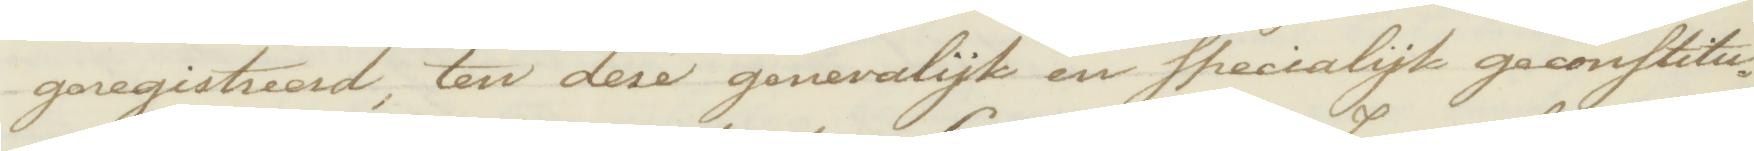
geregistreerd, ten deze generalijk en specialijk geconstitu„
